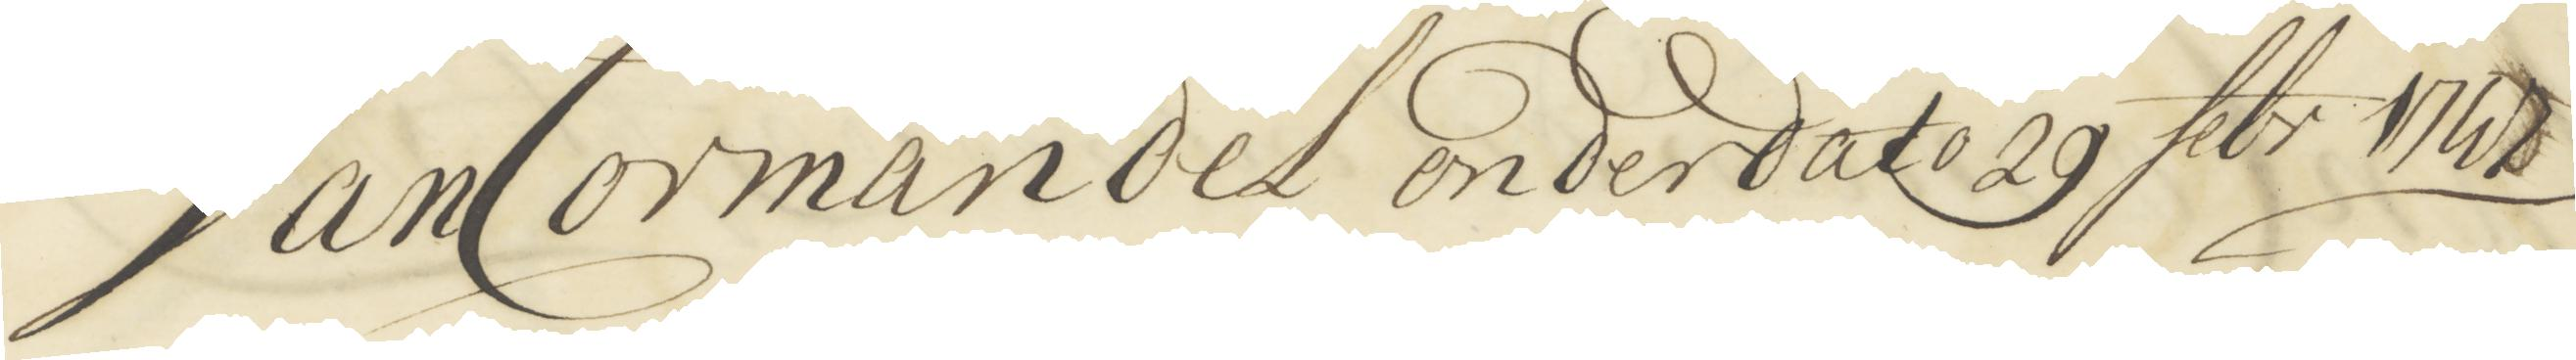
Van Cormandel onder dato 29 febr: 1747
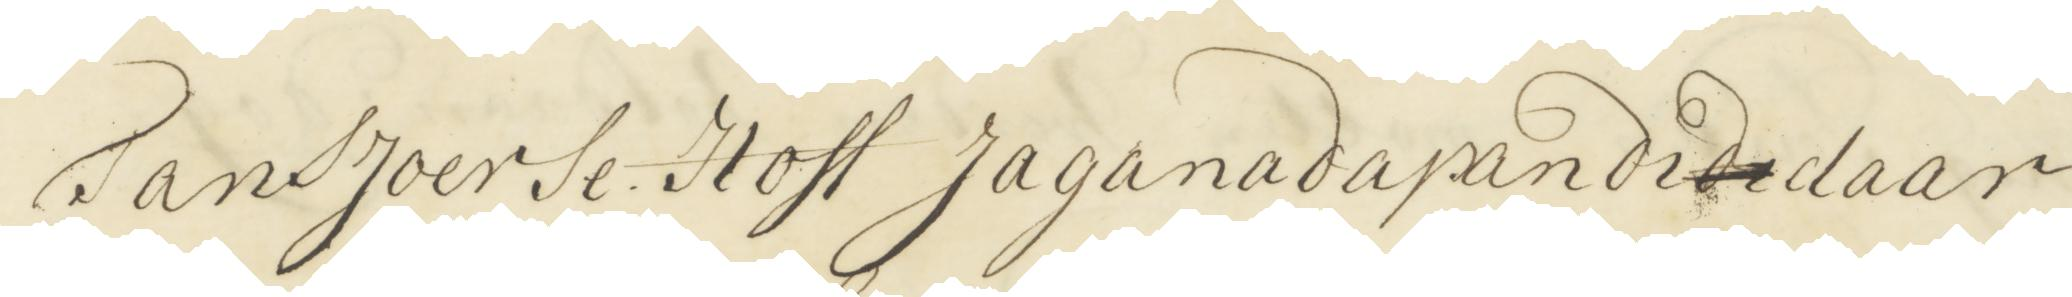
Tansjoerse. Hoff Jaganadapandi di daar
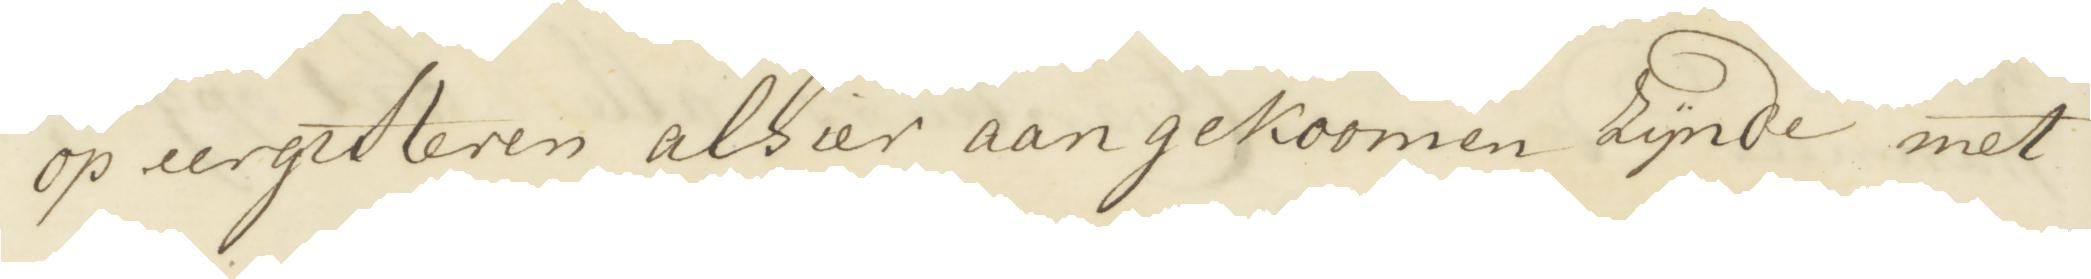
op eergisteren alhier aangekoomen zijnde met
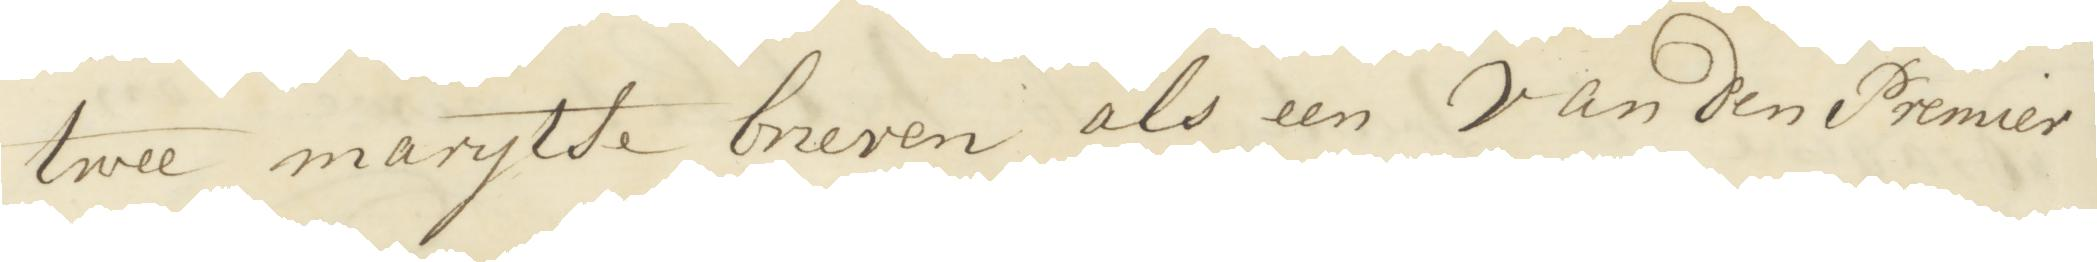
twee marytse brieven als een van den Premier
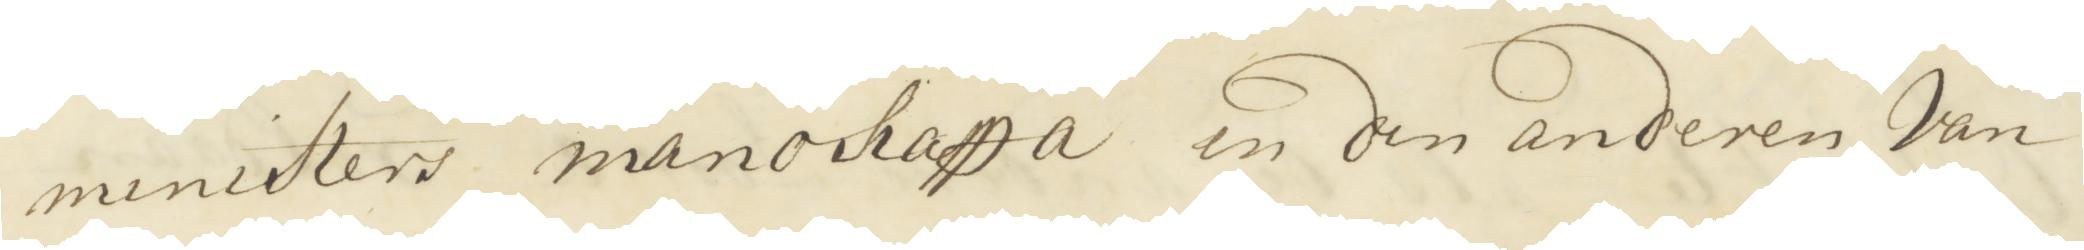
ministers manosiappa en den anderen van
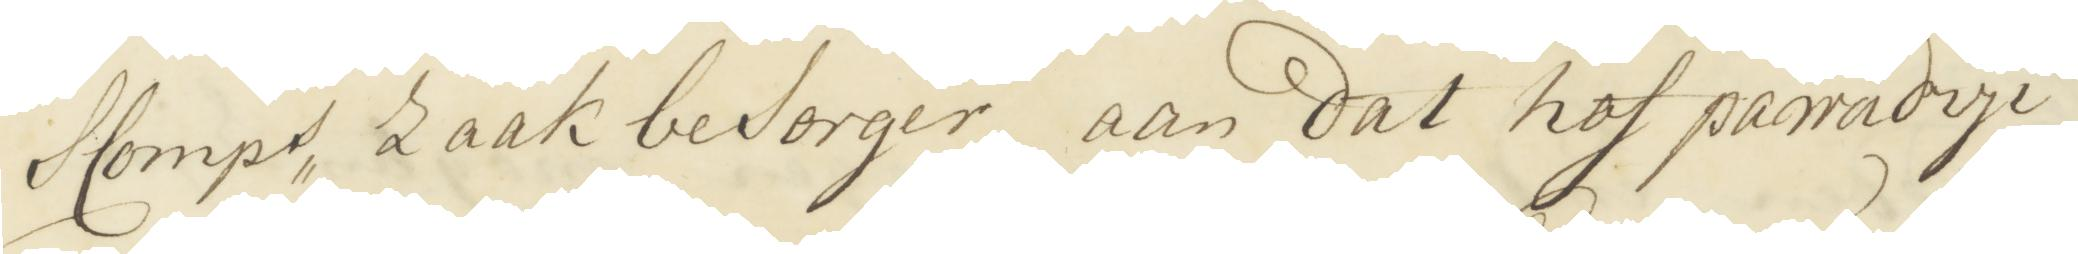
sComp„s, zaak besorger aan dat hof pawadiji
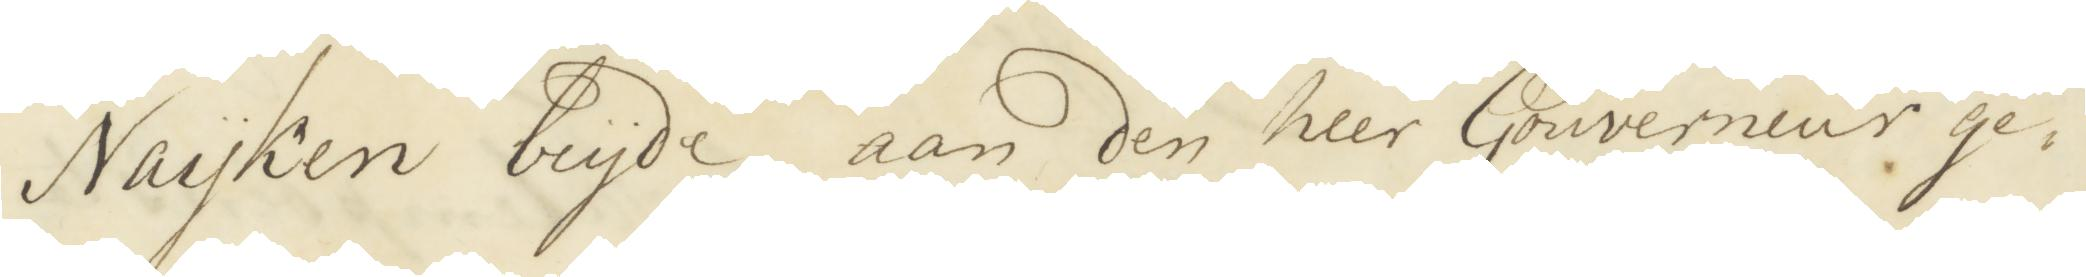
Naijken beijde aan den heer Gouverneur ge„
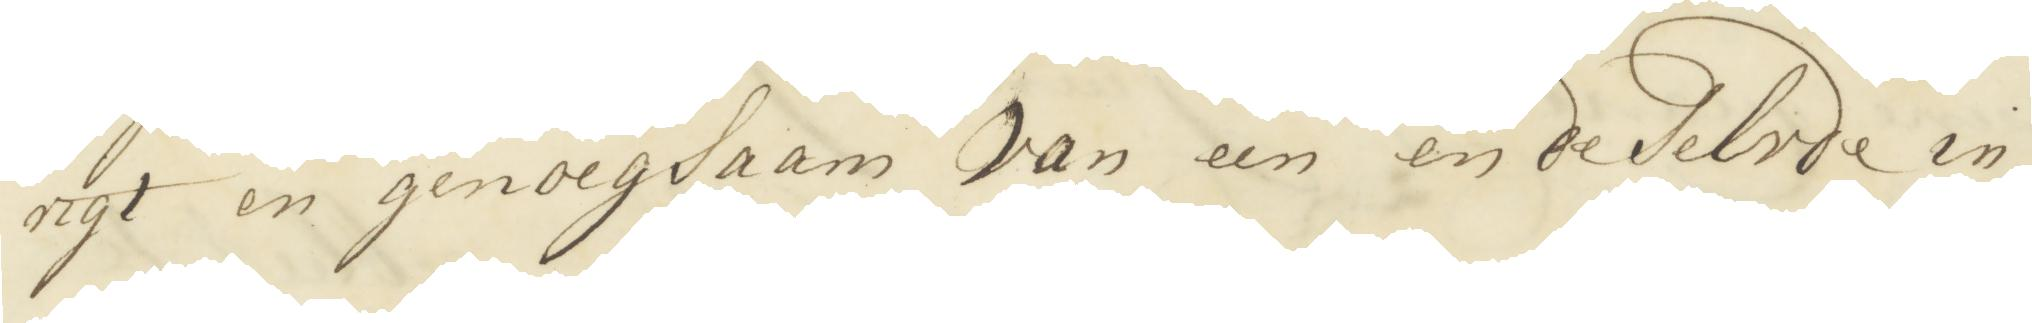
rigt en genoegsaam van een en deselvde in
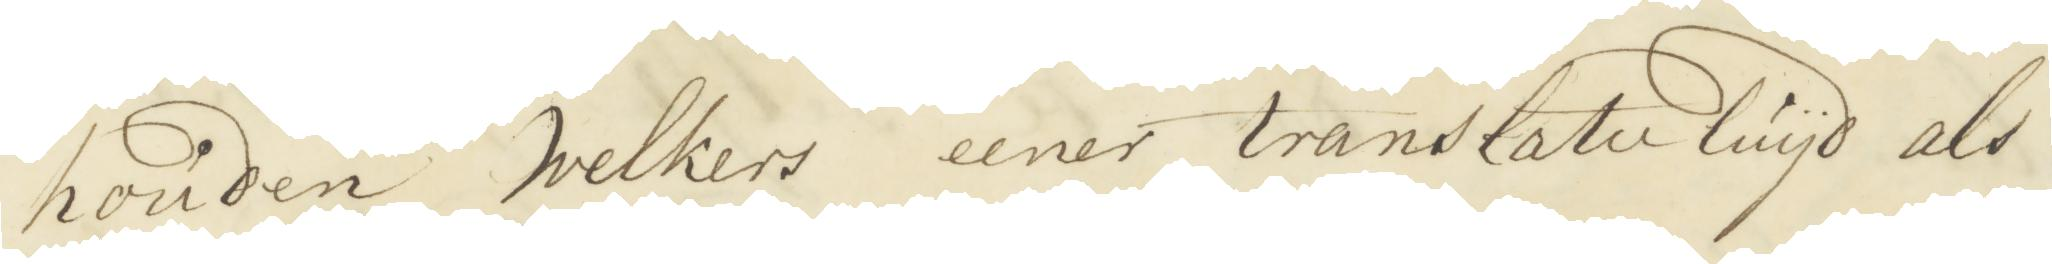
houden welkers eener translatie luijd als
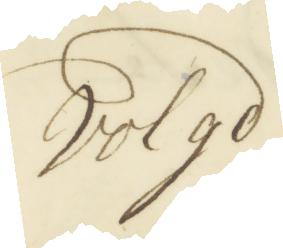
volgd
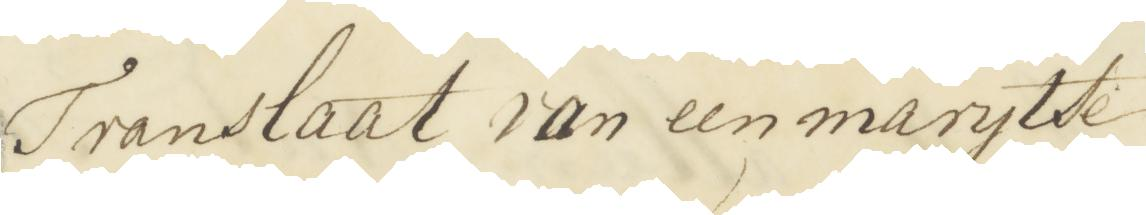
Translaat van een marytse
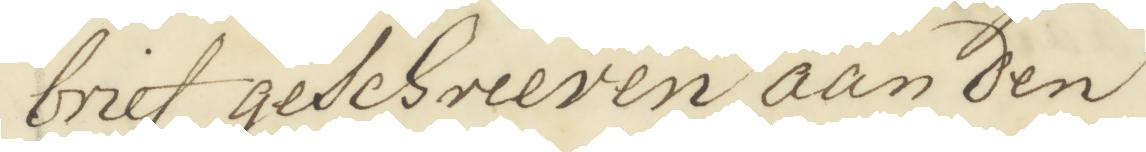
brief geschreeven aan den
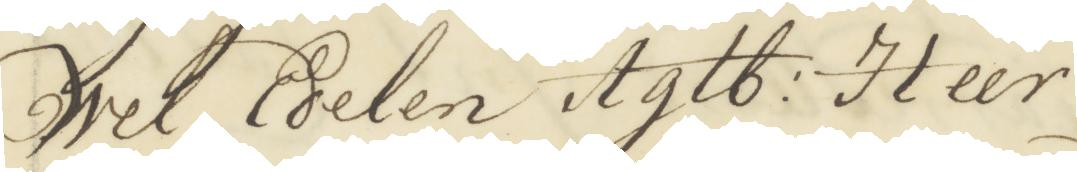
Wel Edelen Agtb: Heer
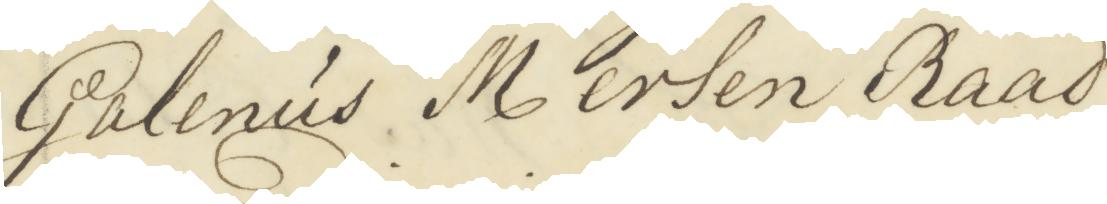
Galenus Mersen Raad
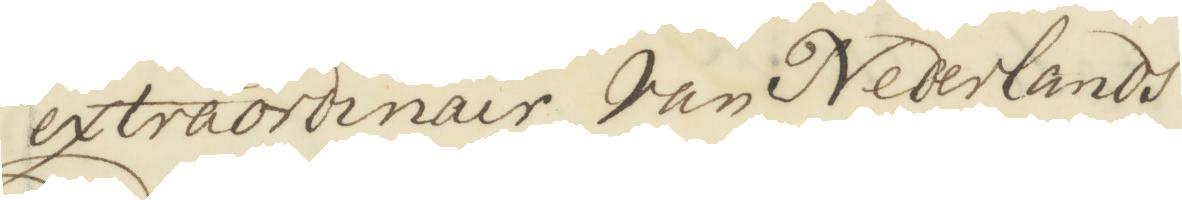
extraordinair van Nederlands
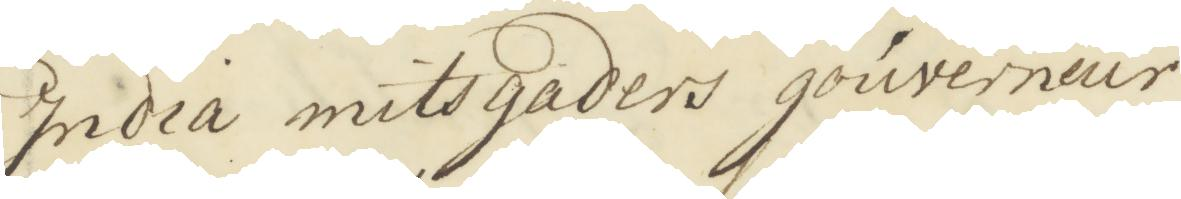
Jndia mitsgaders gouverneur
